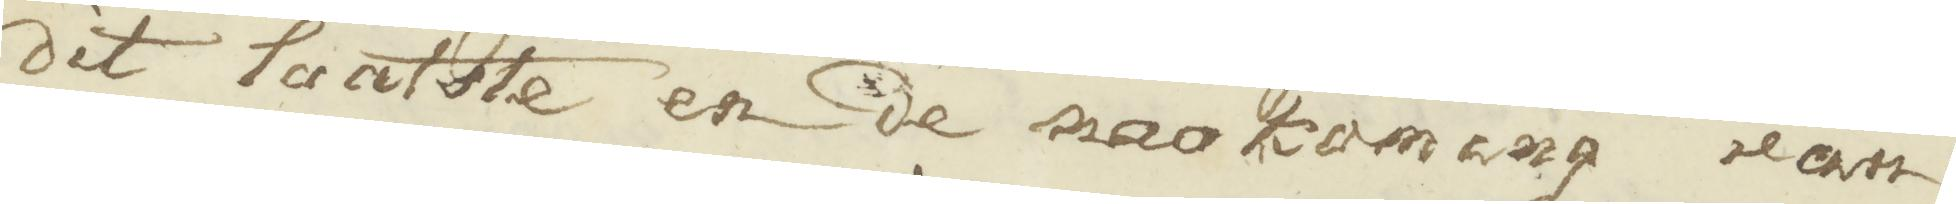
dit laatste en de naakoming van
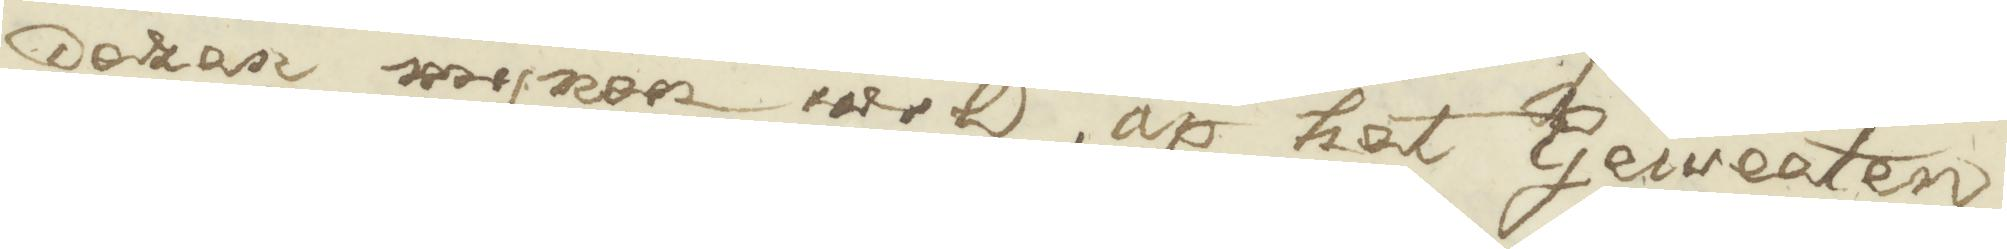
dezen mynen wil, op het Geweeten
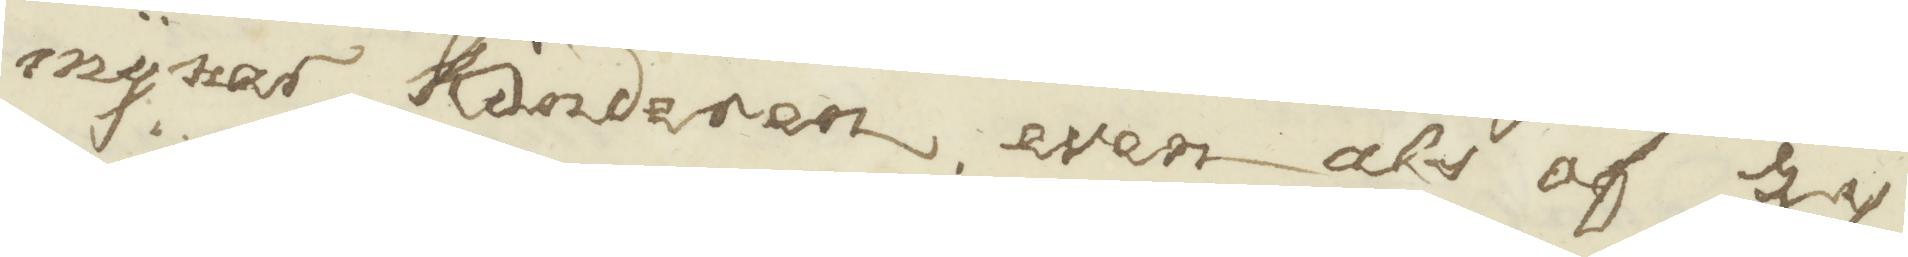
mijner kinderen, even als of zij
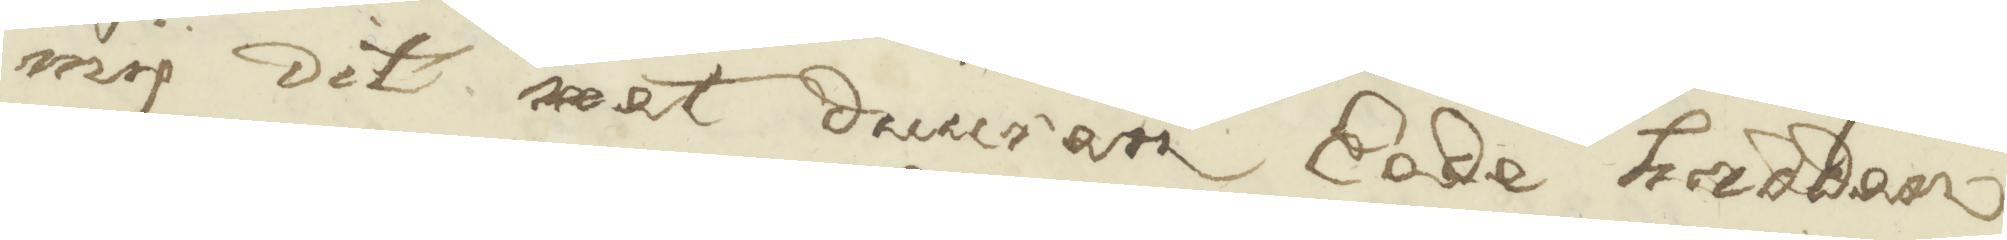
mij dit met duuren Eede hadden
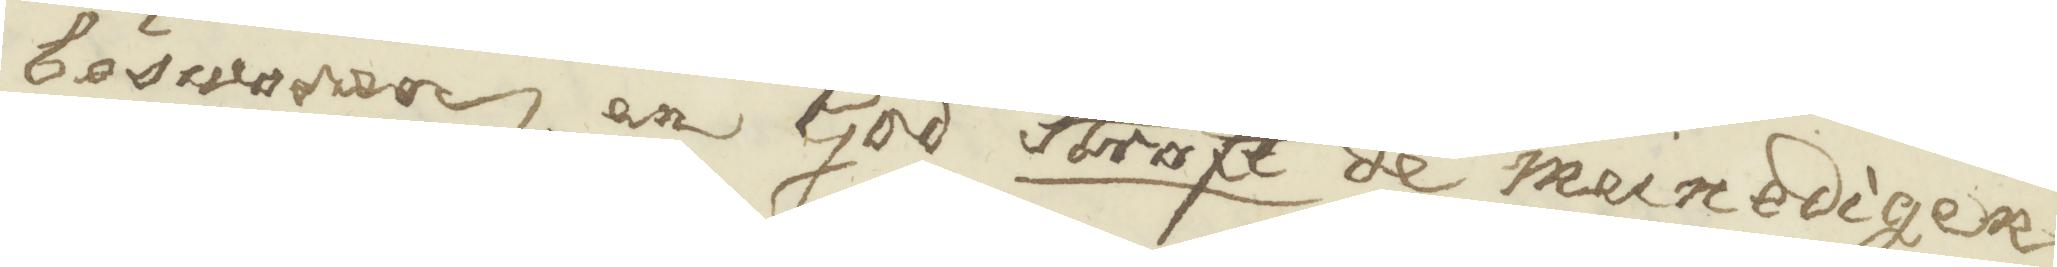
besworen, en God straft de meinediger
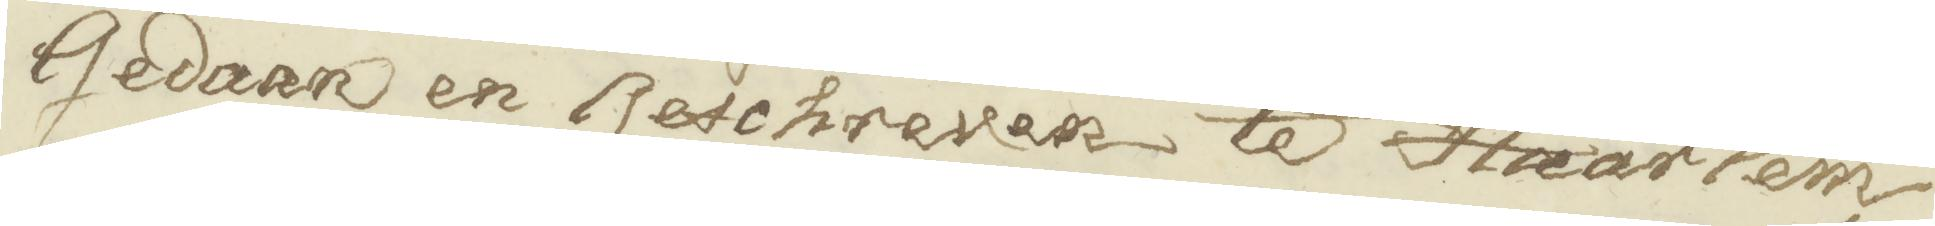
Gedaan en geschreven te Haarlem
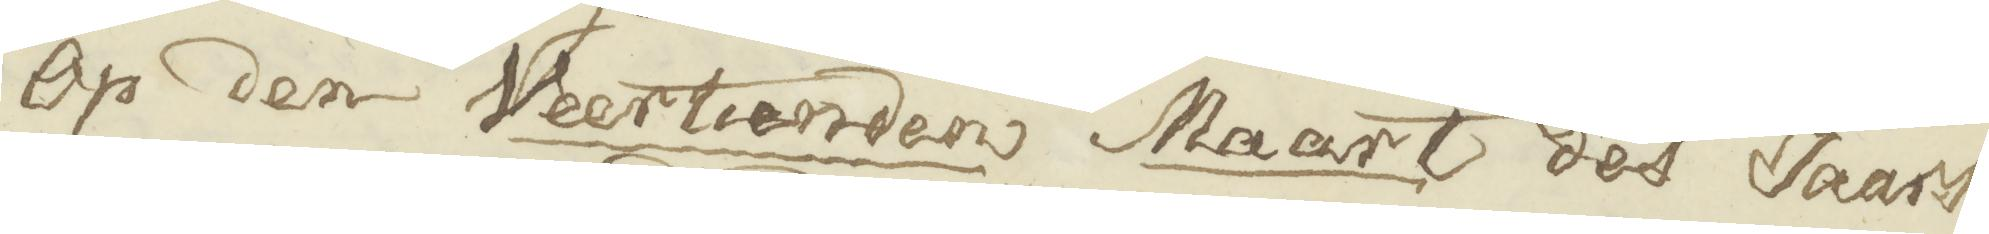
Op den Veertienden Maart des Jaars
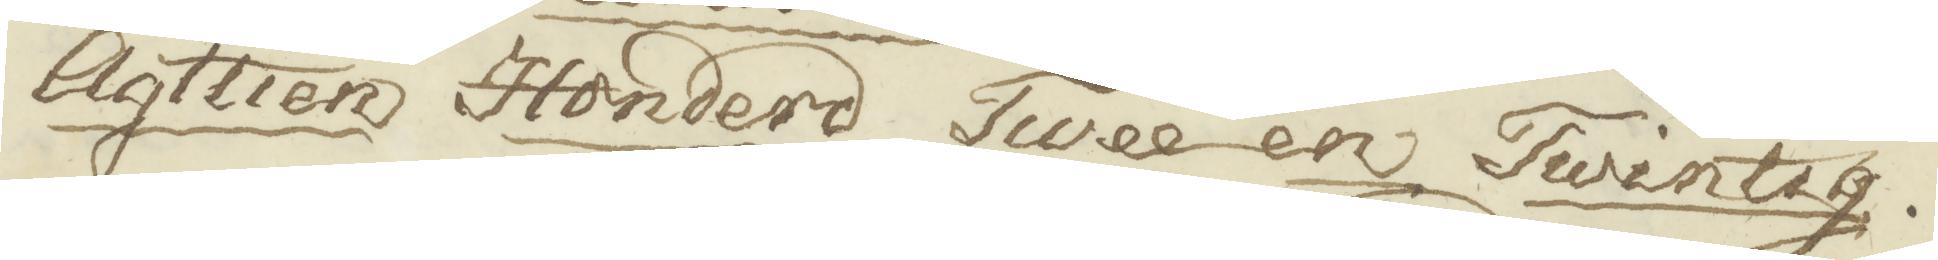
Agttien Honderd Twee en Twintig.
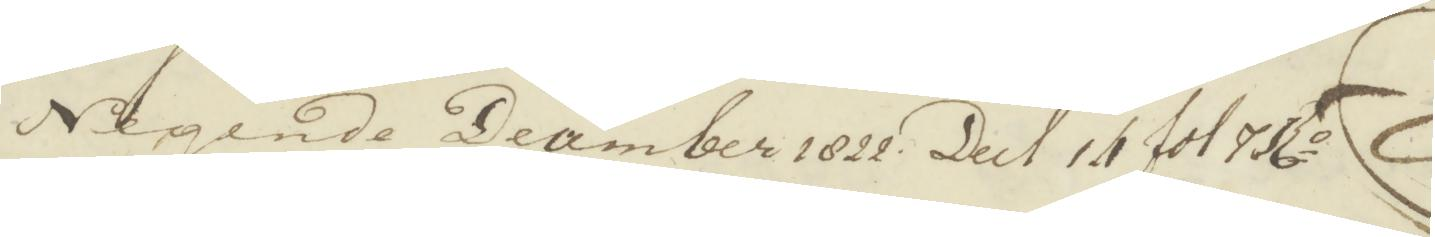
Negende December 1822. Deel 14 fol 7 R=o
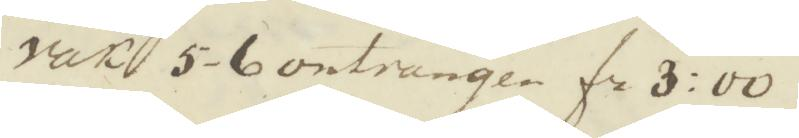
vak 5-6 ontvangen fr 3: 00
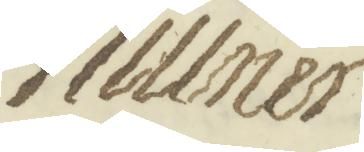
Ruiner
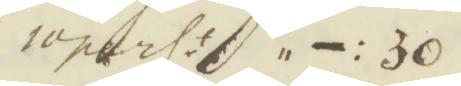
10 perC-t „ — : 30
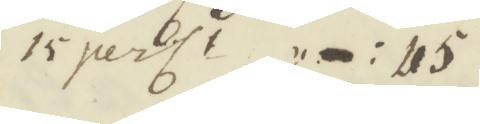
15 perCt „ — : 45
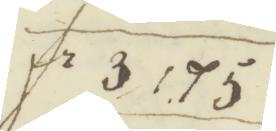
fr 3 1.75
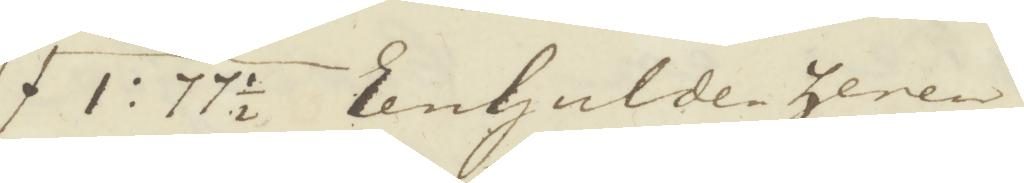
ƒ 1: 77½ Een Gulden zeven
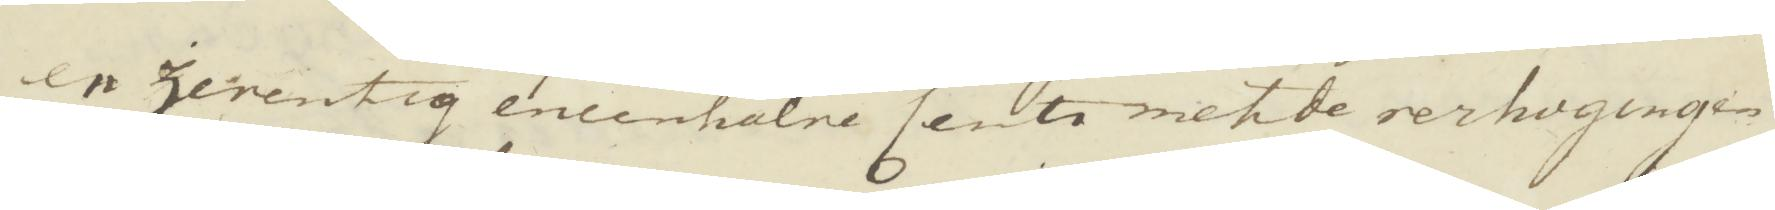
en zeventig en een halve Cents met de verhogingen
